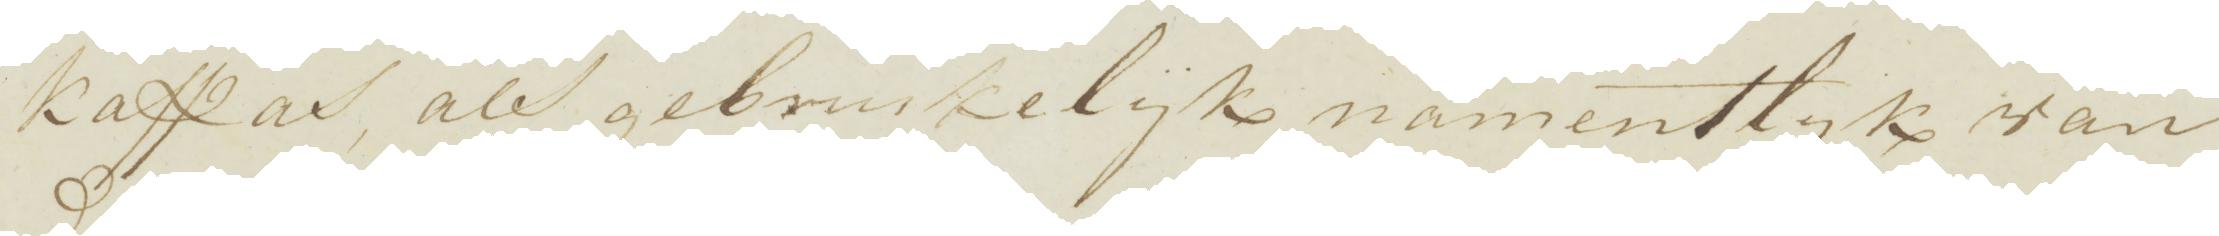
kappas, als gebruikelijk namentlyk van
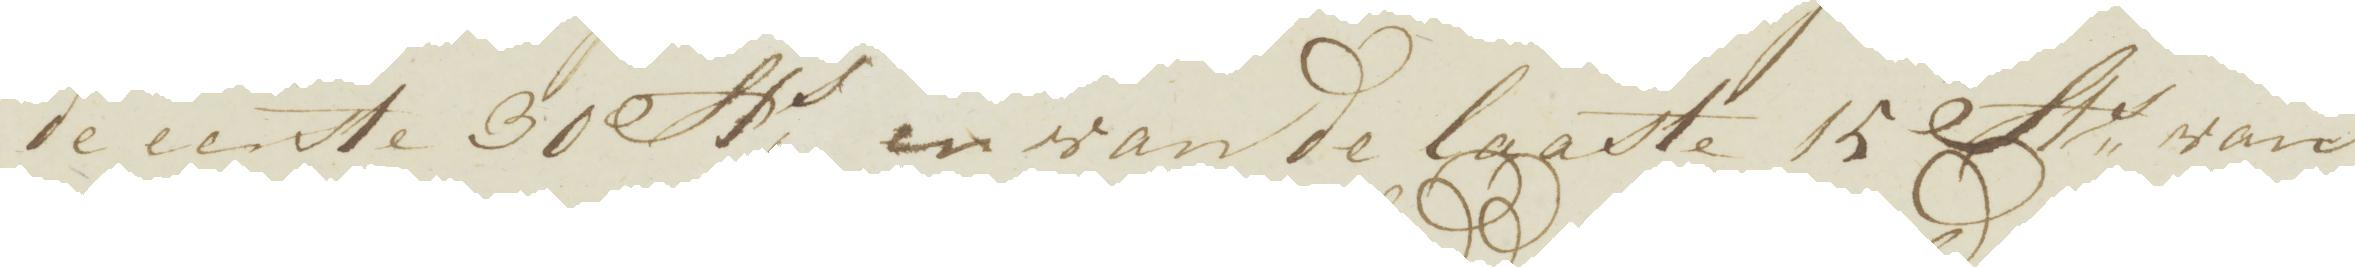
de eerste 30 st„s en van de laaste 15 st„s van
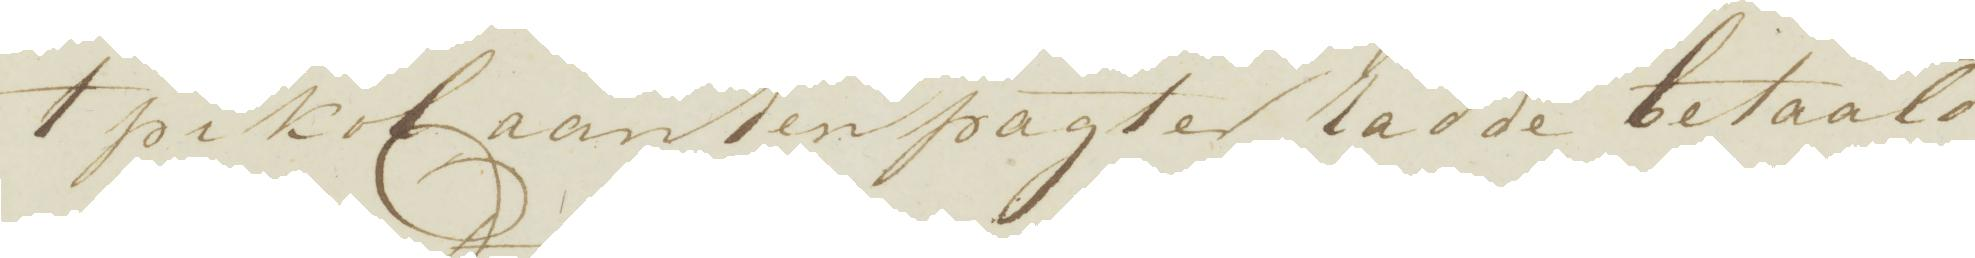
t pikol aan den pagter hadde betaald
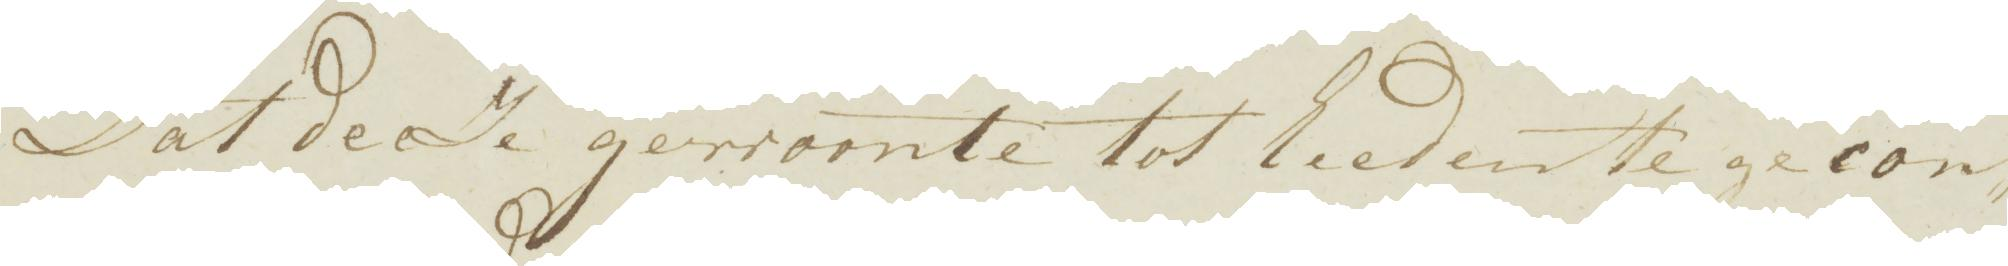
Dat deeze gewoonte tot heeden te gecon
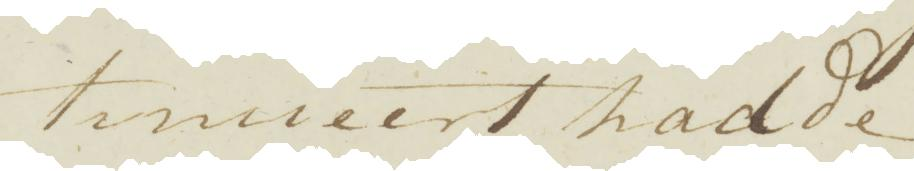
tinueert hadde
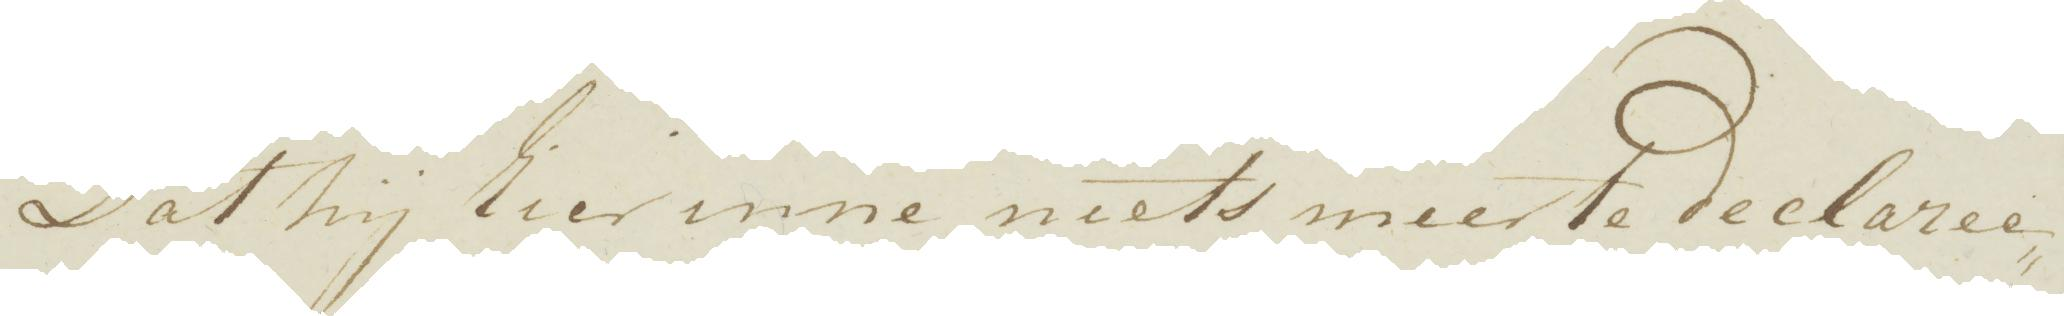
Dat hij hier inne niets meer te declaree„
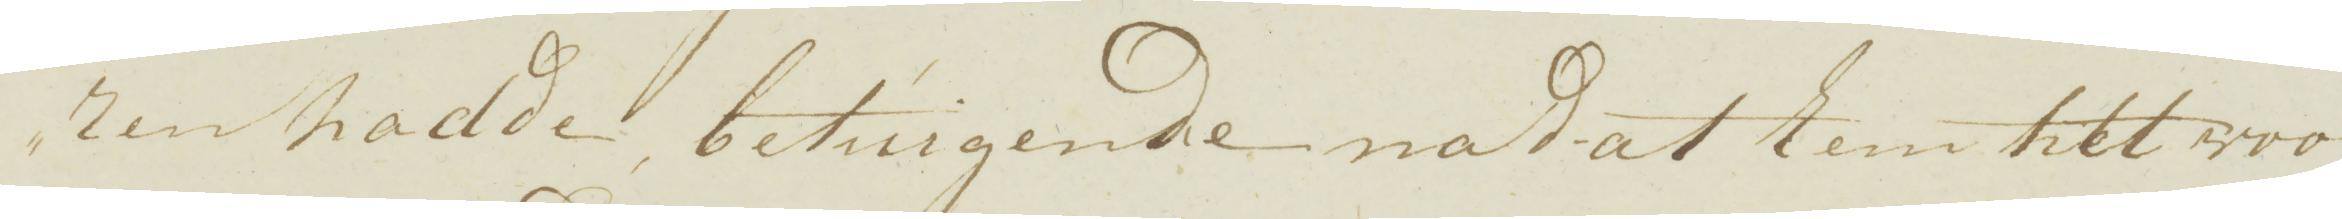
„ren hadde, betuigende na dat hem het voo„
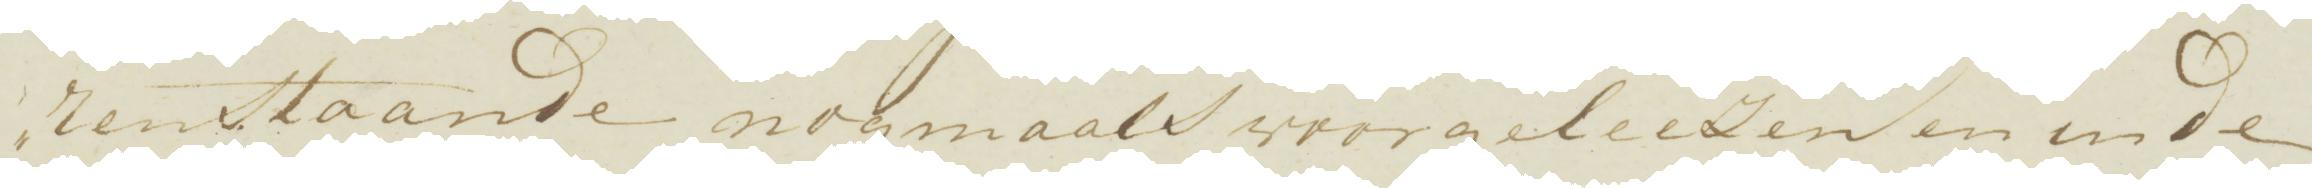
„renstaande nogmaals voor geleezen en in de
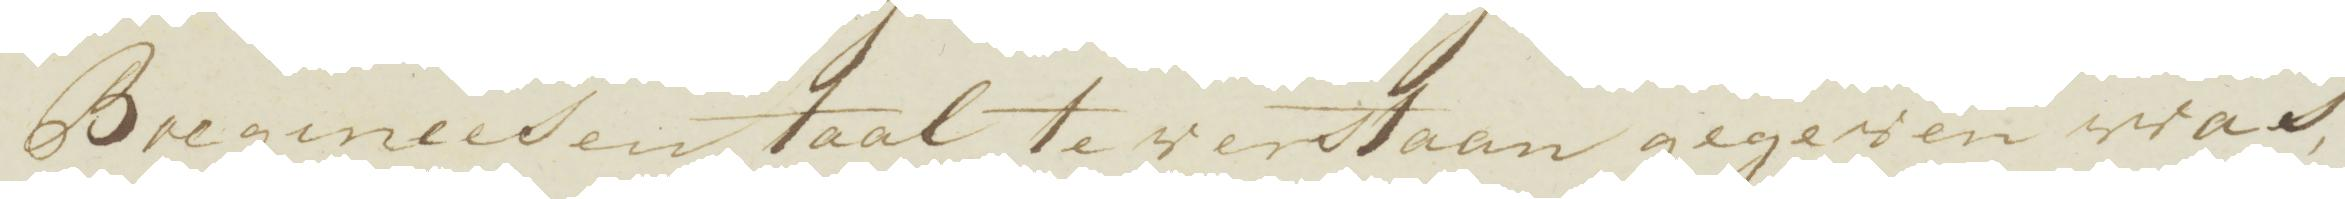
Boegineesen taal te verstaan gegeven was,
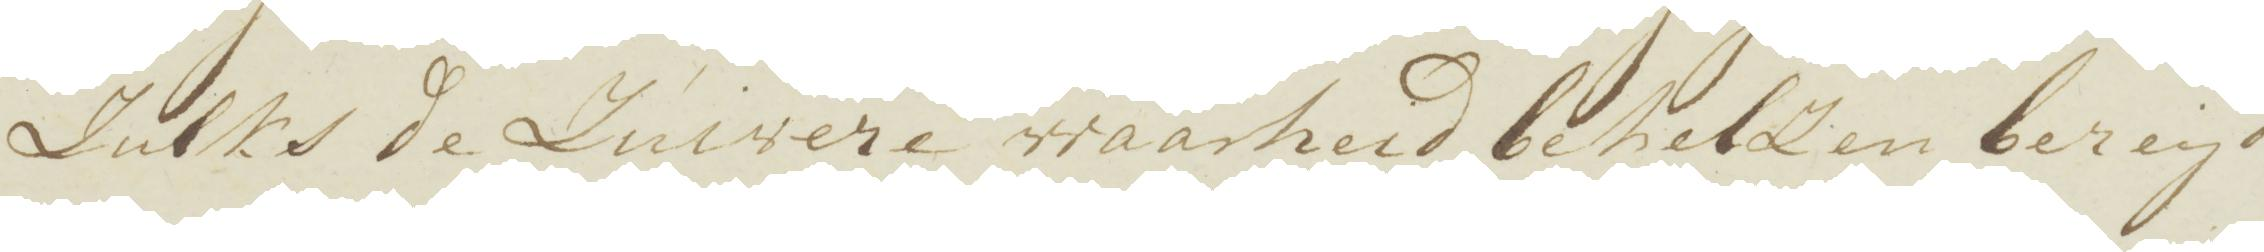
zulks de zuivere waarheid behelzen bereijd
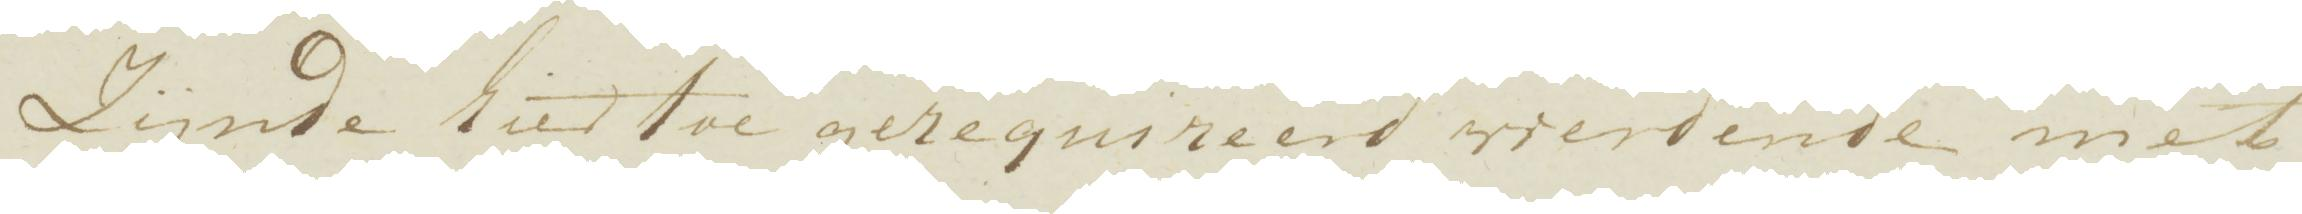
zijnde hier toe gerequireerd werdende met
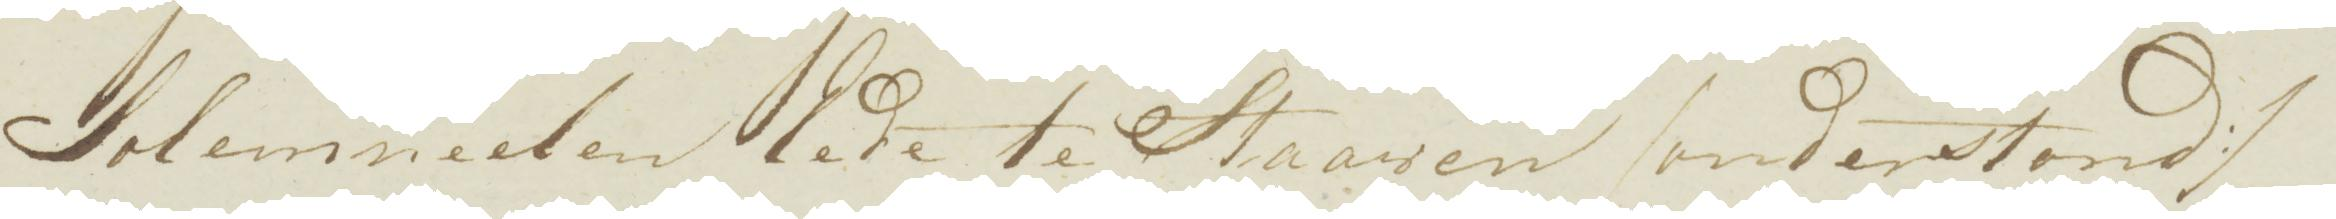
solemneelen Eede te staaven /onderstond:/
